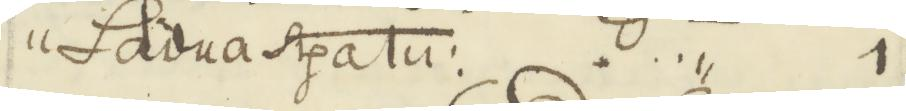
„ Sadraspatn: - - - „ 1
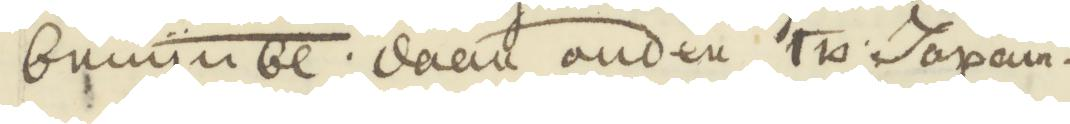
bruijn bl: daar onder 't v: Iapan
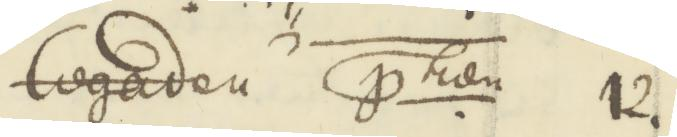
tegoeden p-ken 12.
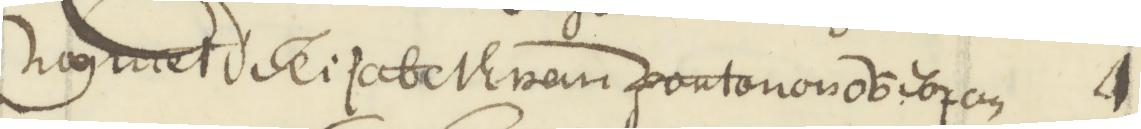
nog met d’ Elisabeth van portonovo v. Iapan 4
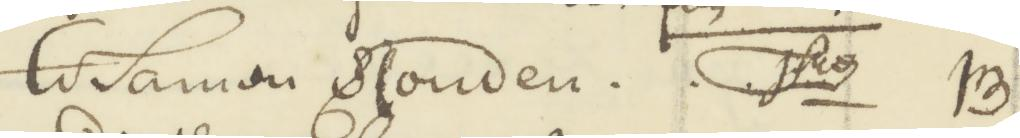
tesamen versonden - - - p=ken 13
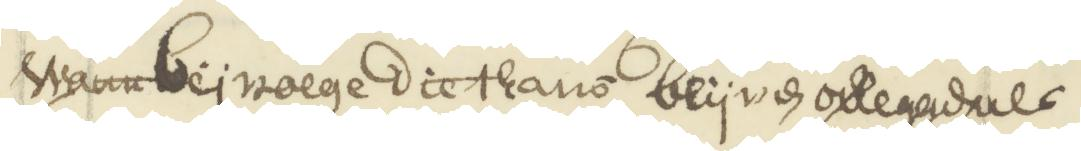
Waar bij voege die thans blijven overleggen als
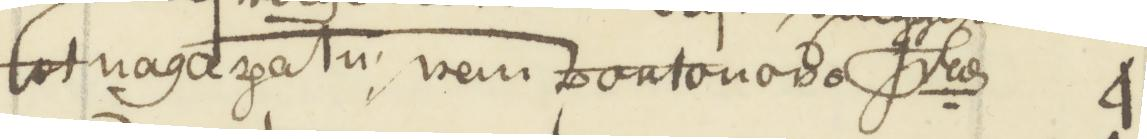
tot nagepatn: van portonovo p=ken 4
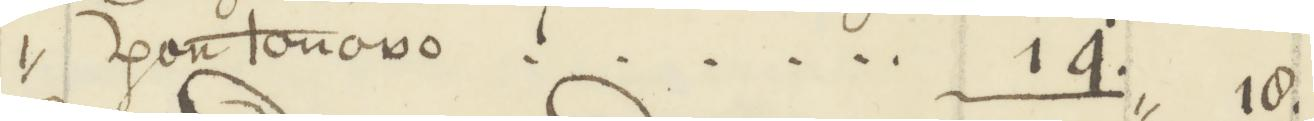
„ portonovo - - - - - - „ 14. „ 18.
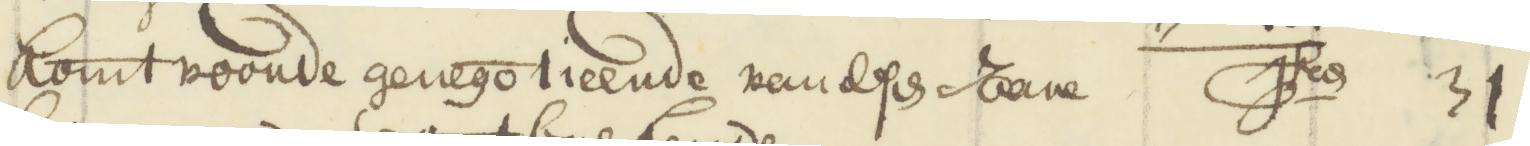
komt voorde genegotieerde van desen Iare p-ken 31
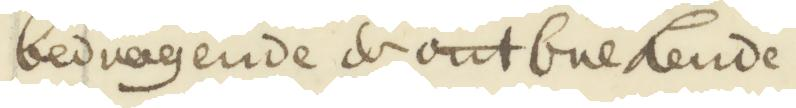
bedragende de ontbrekende
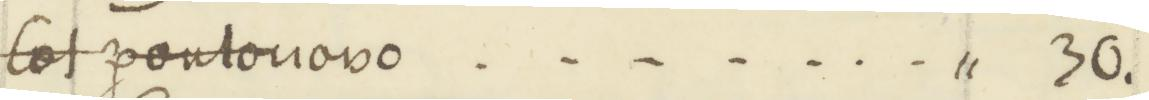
tot portonovo - - - - - - - „ 30.
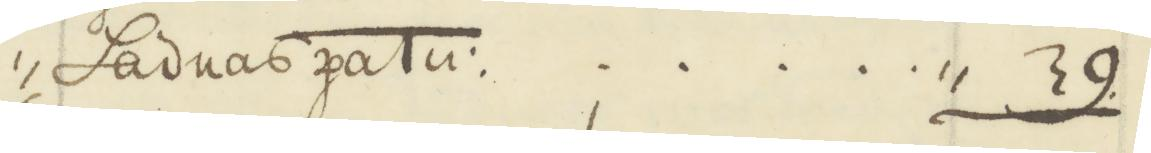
„ sadraspatn: - - - - - „ 39.
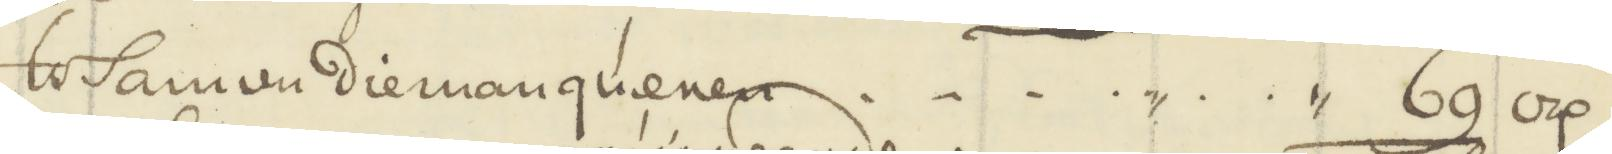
te samen diemanqueren - - - - „ - - „ 69 op
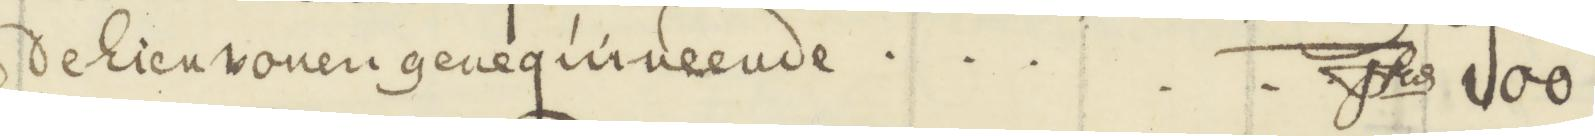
de hier voren gerequireerde - - - - - p-ken 100
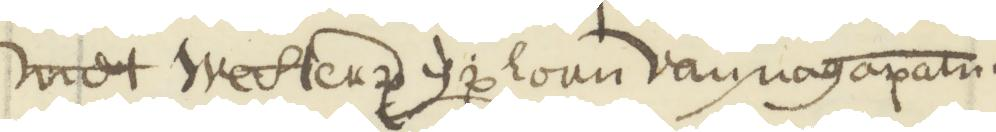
met westerdyxhorn van nagapatn
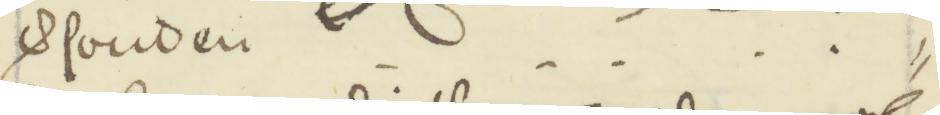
versonden - - - - - „
